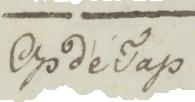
Op de Tap
